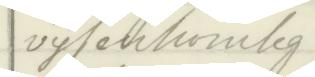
vyf entwintig
